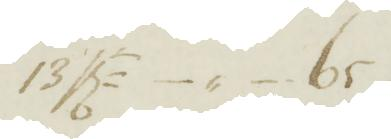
13 /c=t — „ — . 65
